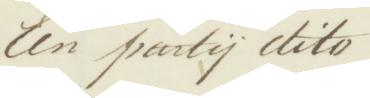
Een partij dito
